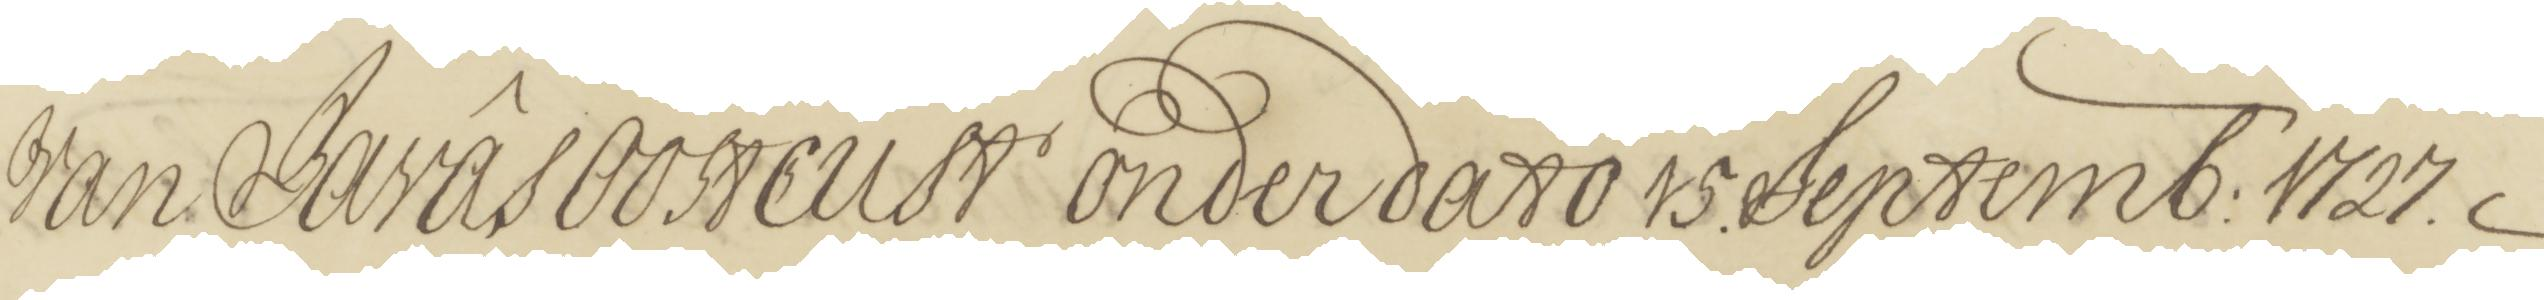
Van Javâs Oostcust onder dato 15. Septemb: 1727. —
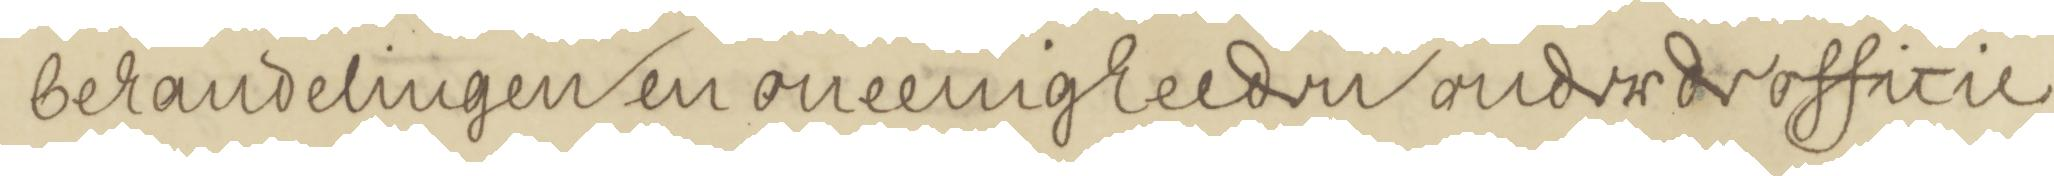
behandelingen en oneenigheeden onder de officie
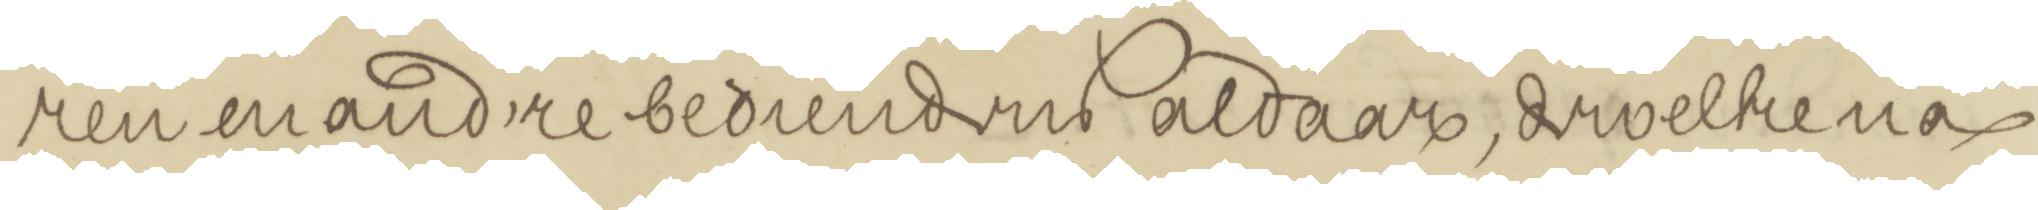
ren en and're bediendens aldaar, dewelke na
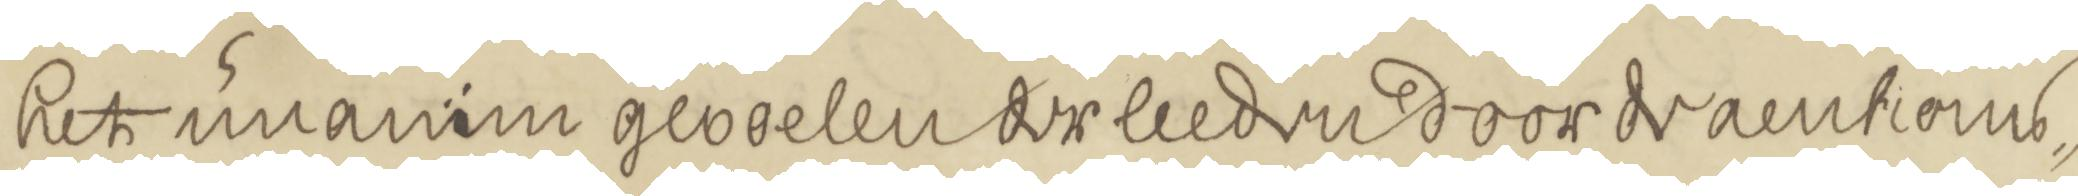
het unanim gevoelen der leeden door de aenkoms„
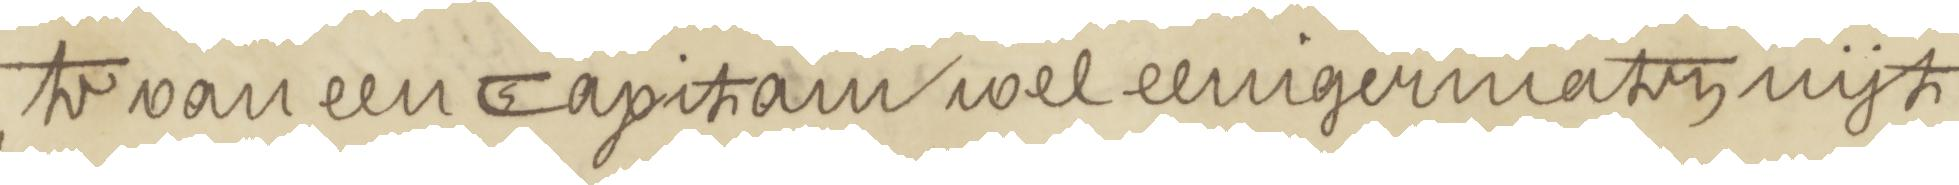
te van een capitain wel eenigermaten uijt
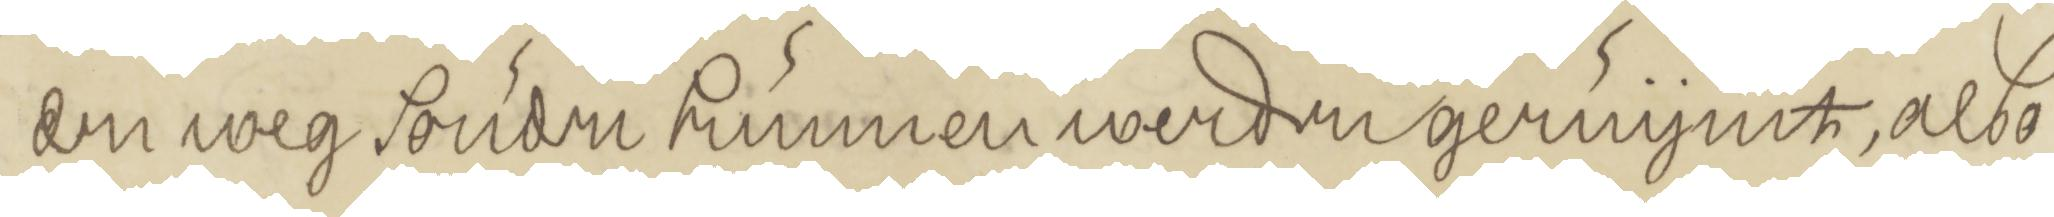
den weg souden kunnen werden geruijmt, also
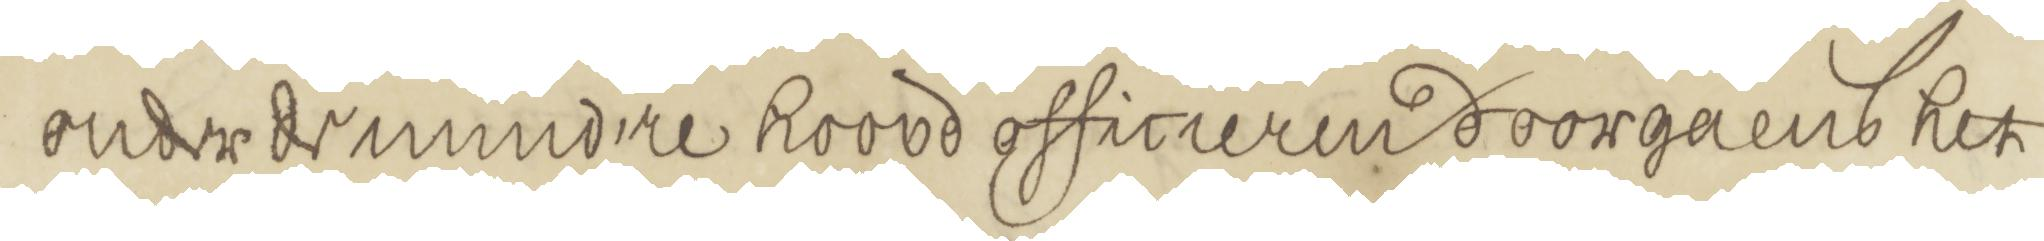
onder de mind're hoovd officieren doorgaens het
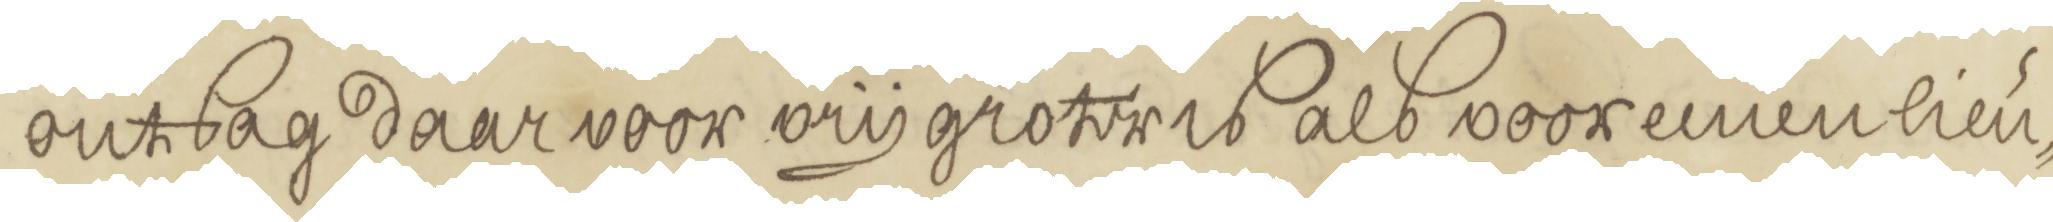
ontsag daar voor vrij groter is als voor eenen lieu
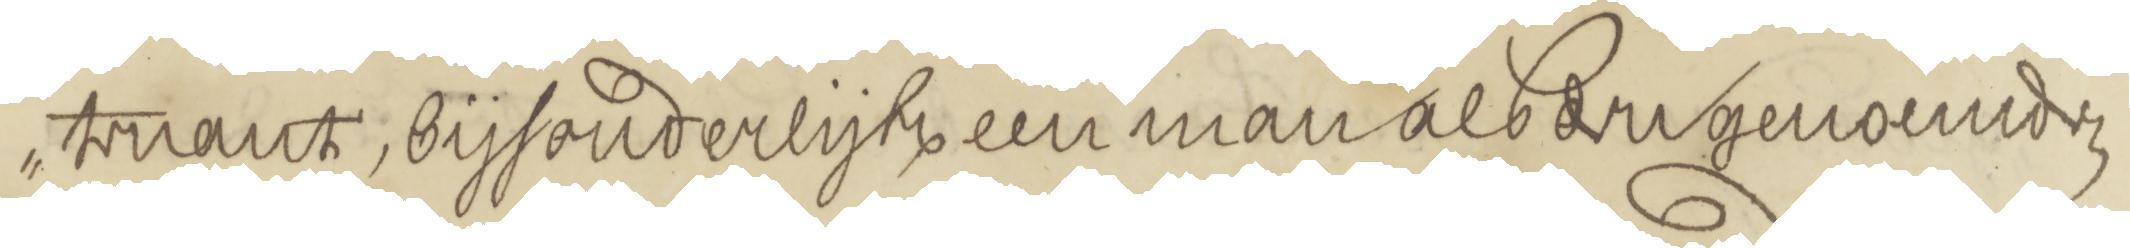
„tenant, bijsonderlijk een man als den genoemden
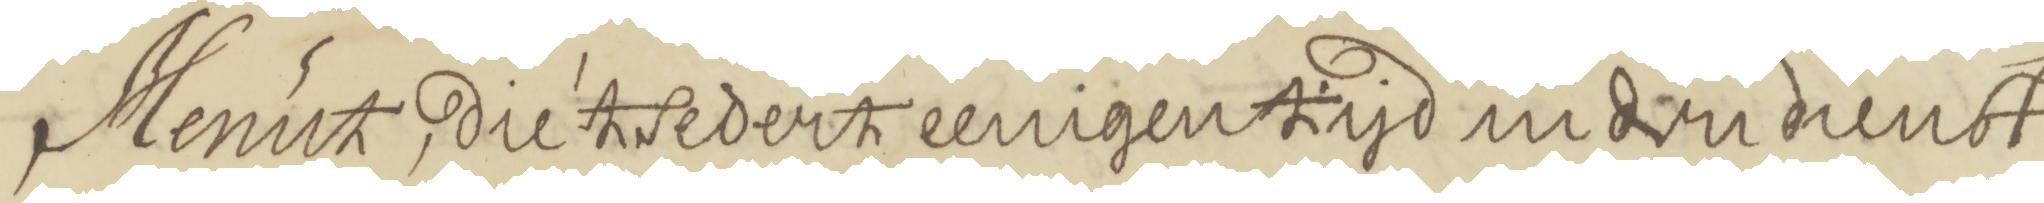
Menut, die 'tsedert eenigen tijd in den dienst
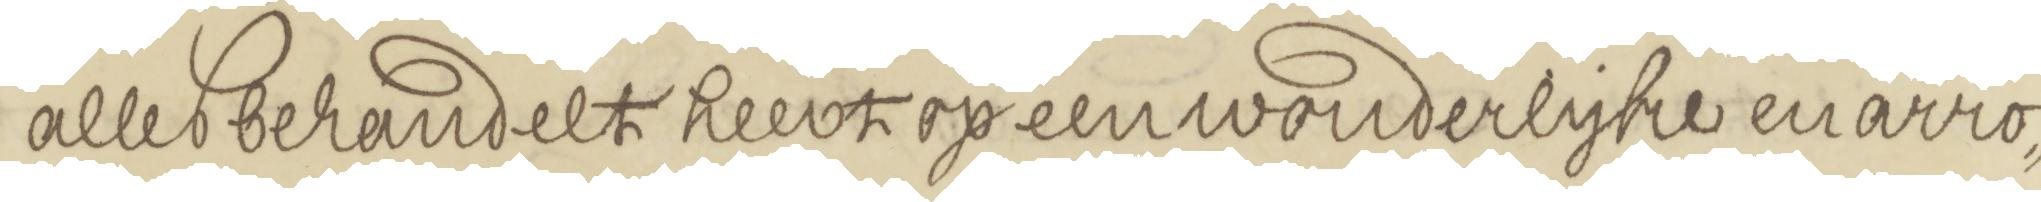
alles behandelt heevt op een wonderlijke en arro„
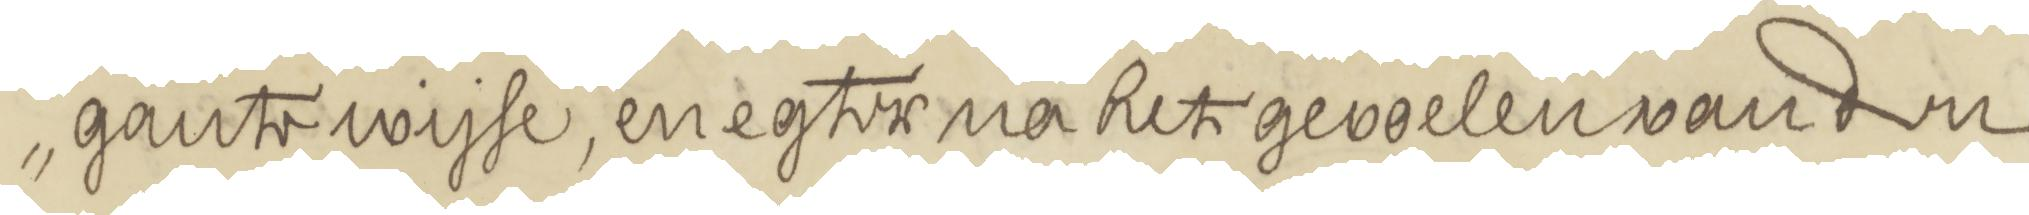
„gante wijse, en egter na het gevoelen van den
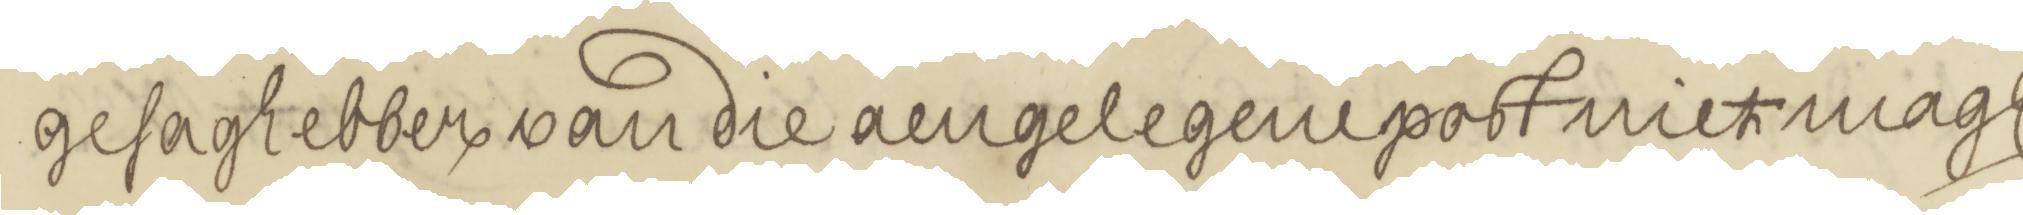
gesaghebber van die aengelegene post niet magh
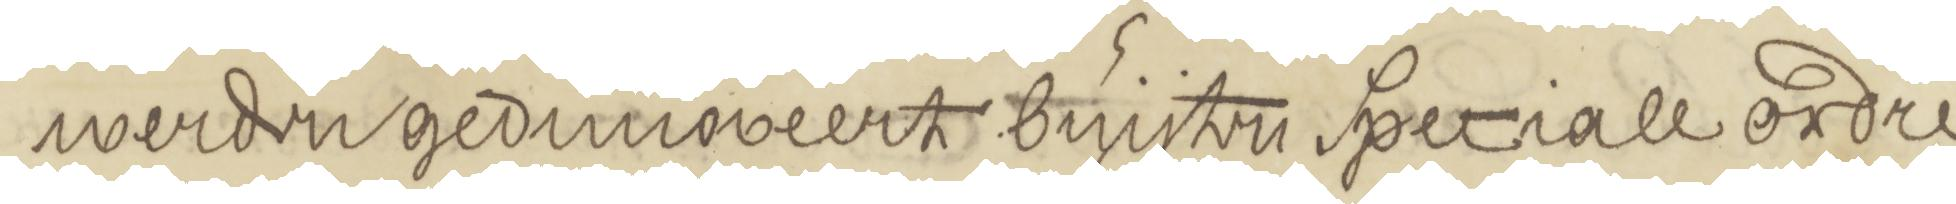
werden gedimoveert buijten speciale ordre
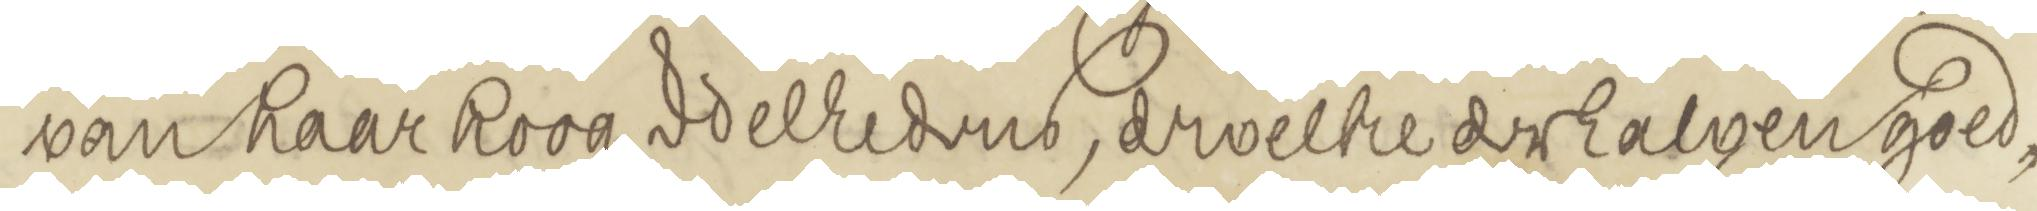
van haar hoog Edelhedens, dewelke derhalven goed
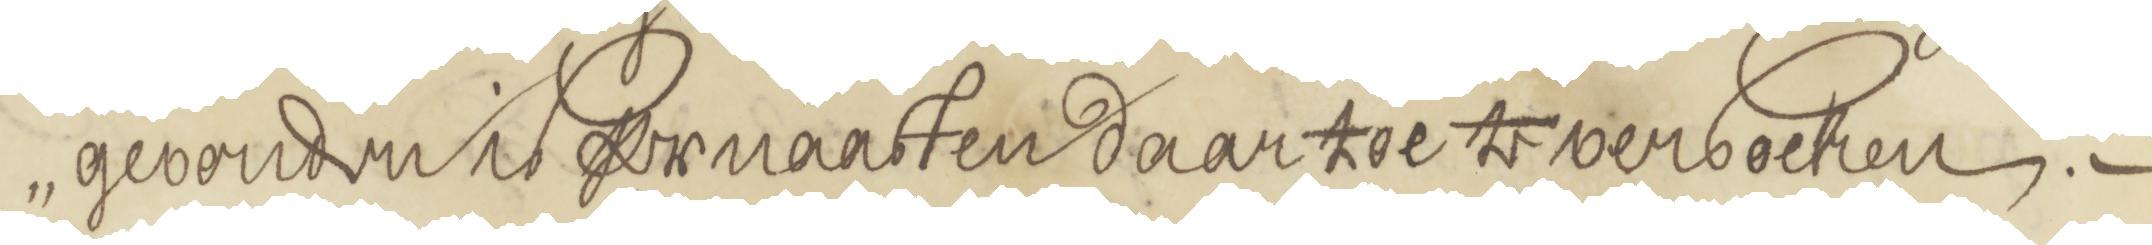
„gevonden is per naasten daar toe te versoeken. —
